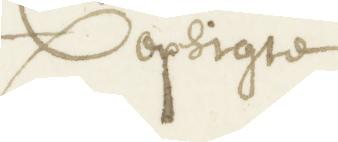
opsigte
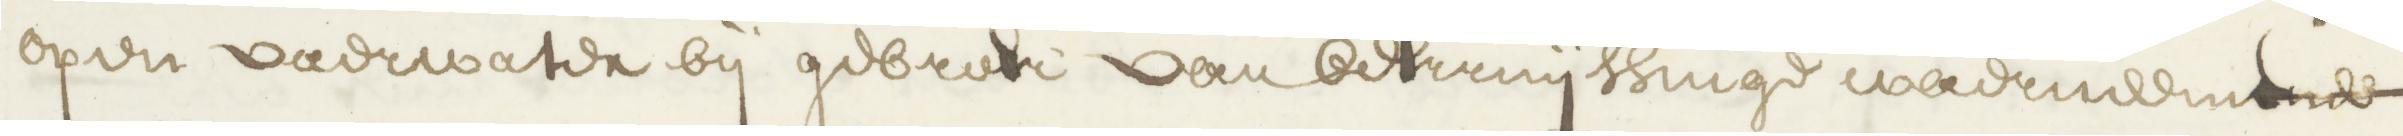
open vaerwater bij gebrek van bekruijssinge waerneemende
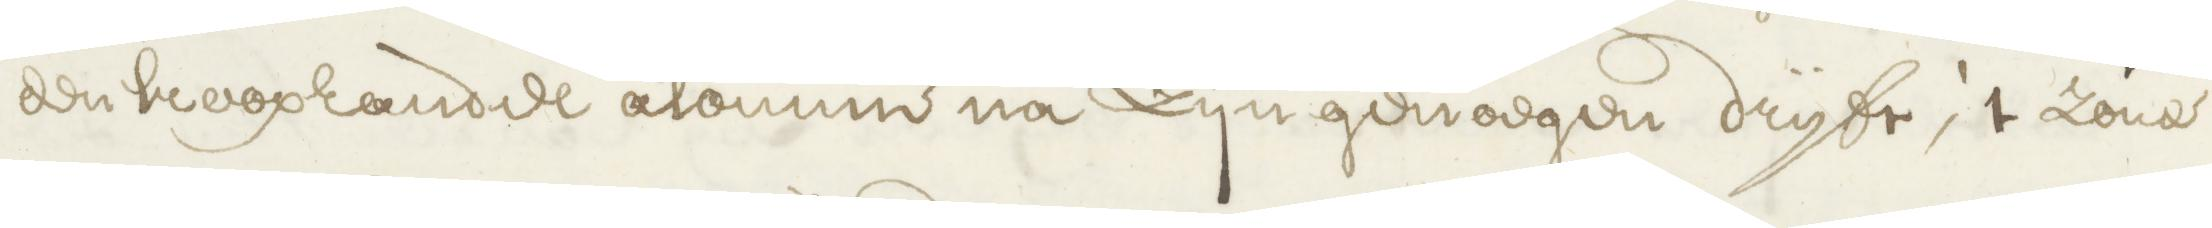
den koophandel alomme na zijn genoegen drijft, ’t zoude
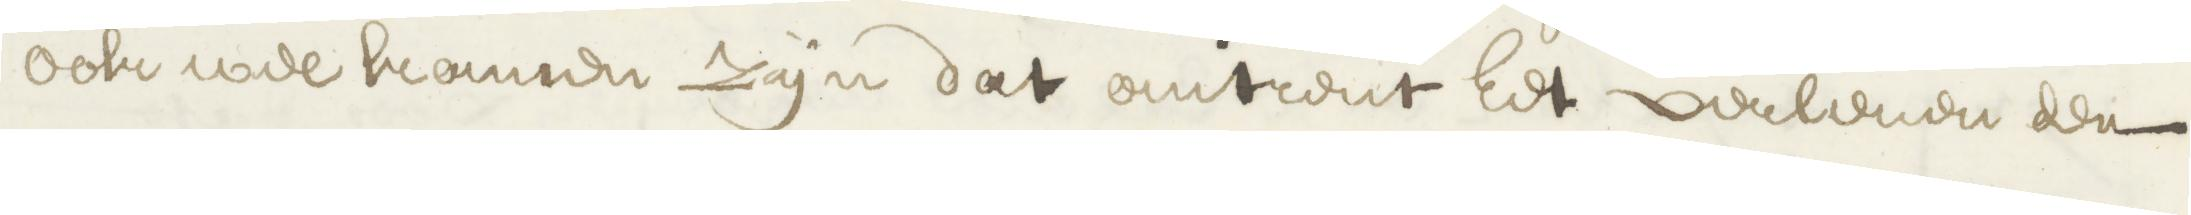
ook wel konnen zijn dat omtrent het verlenen der
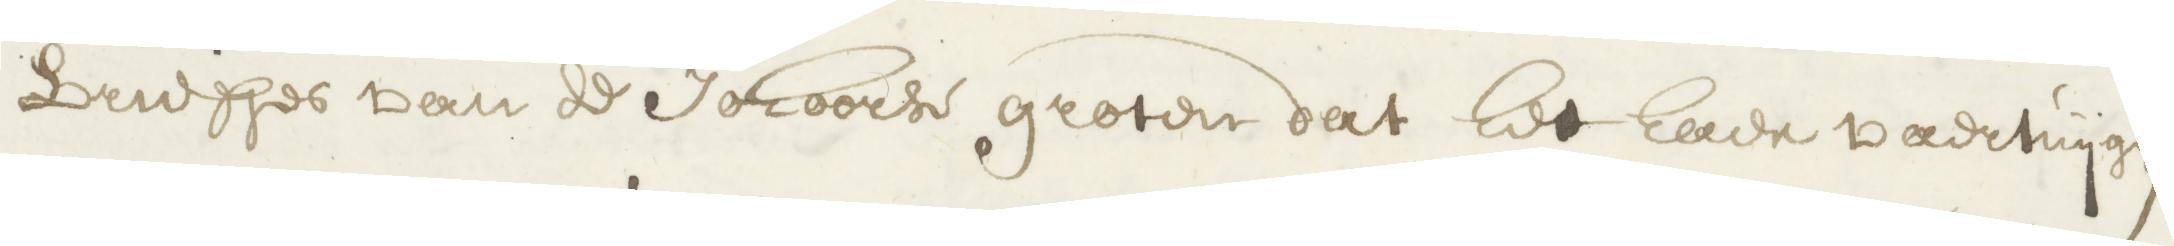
briefjes van de Johoorse groten dat het haer vaertuijgen
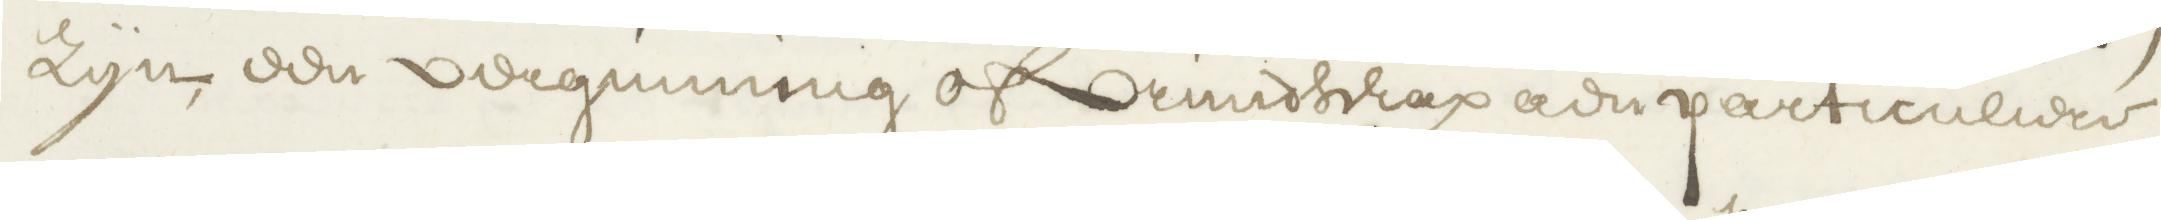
zijn, een vergunnning of vrundschap aen particuliere
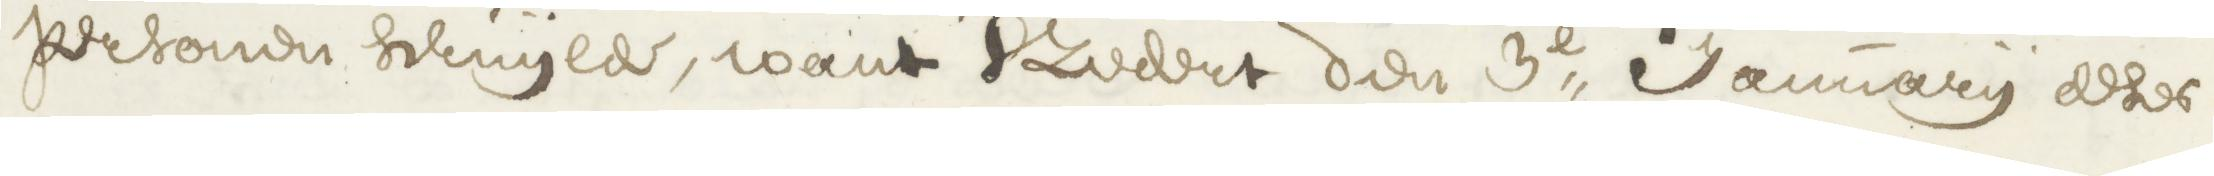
personen schuijlde, want 't zedert den 3„e Januarij deses
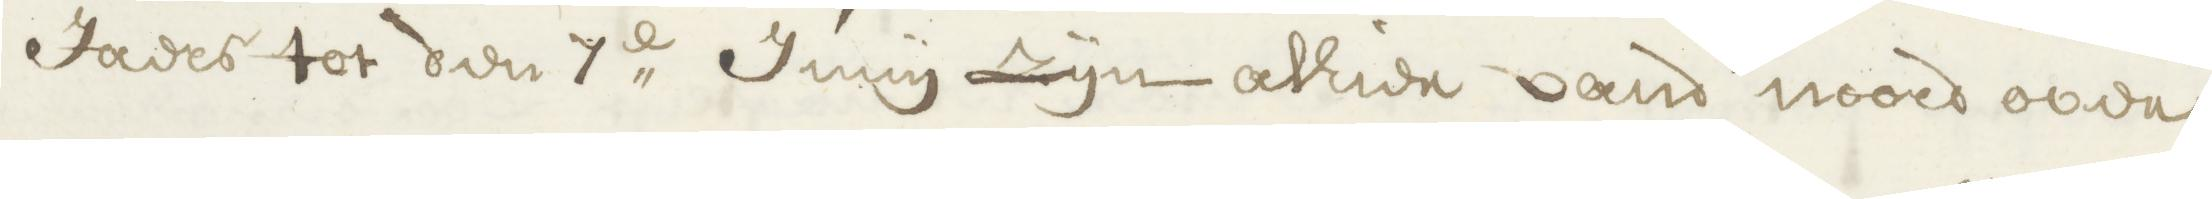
Jaers tot den 7„e Junij zijn alhier vand' noord over
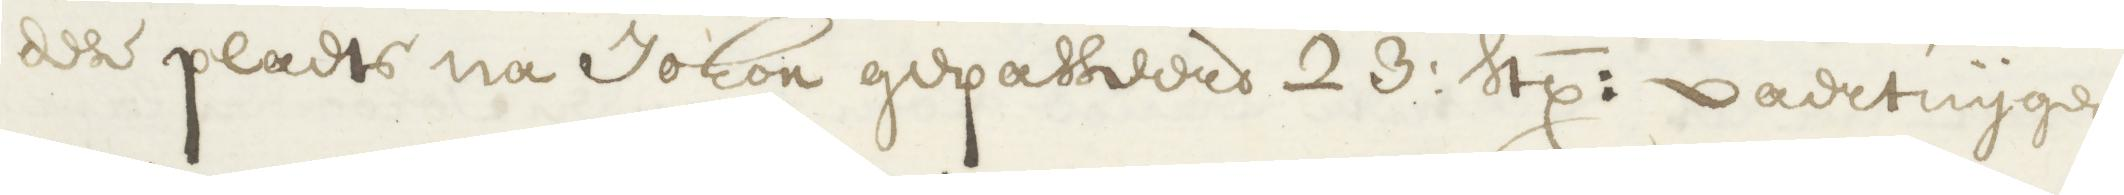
dese plaets na Johor gepasseerd 23: stx: vaertuijgen
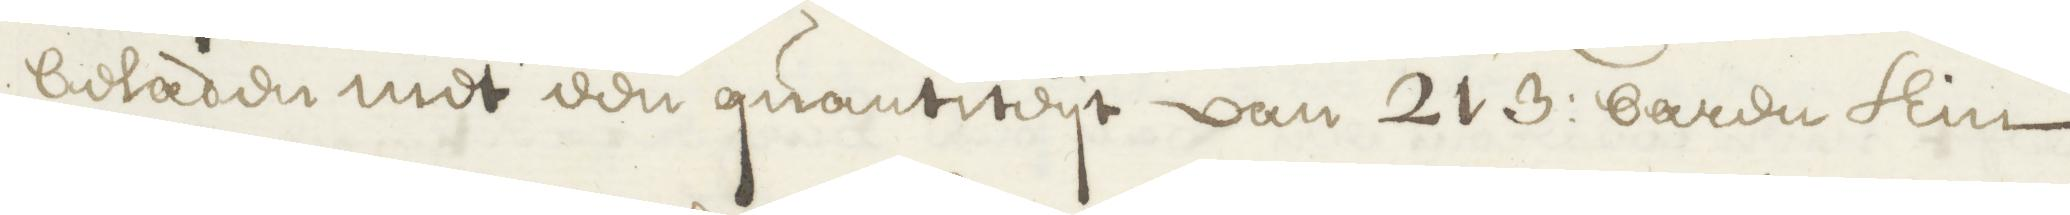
beladen met een quantiteijt van 213: baren thin
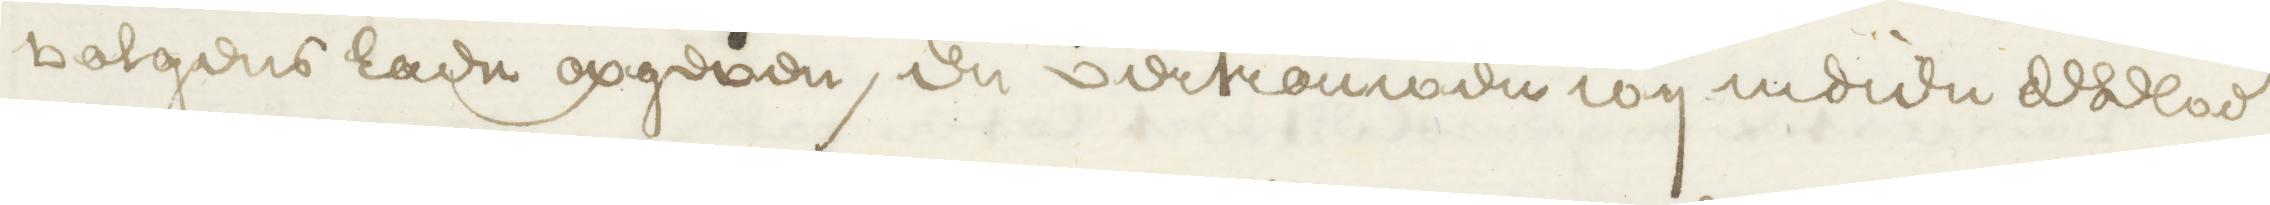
volgens haer opgeven, En vertrouwen wij indien deselve
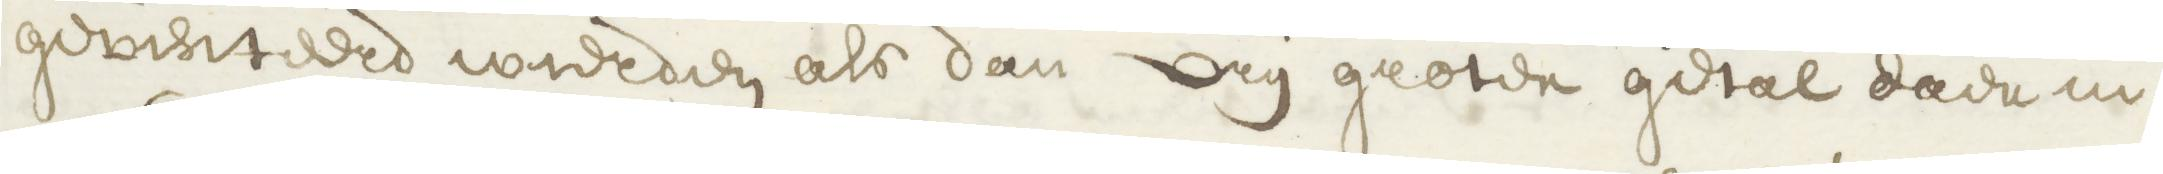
gevisiteerd wierden als dan vrij groter getal daer in
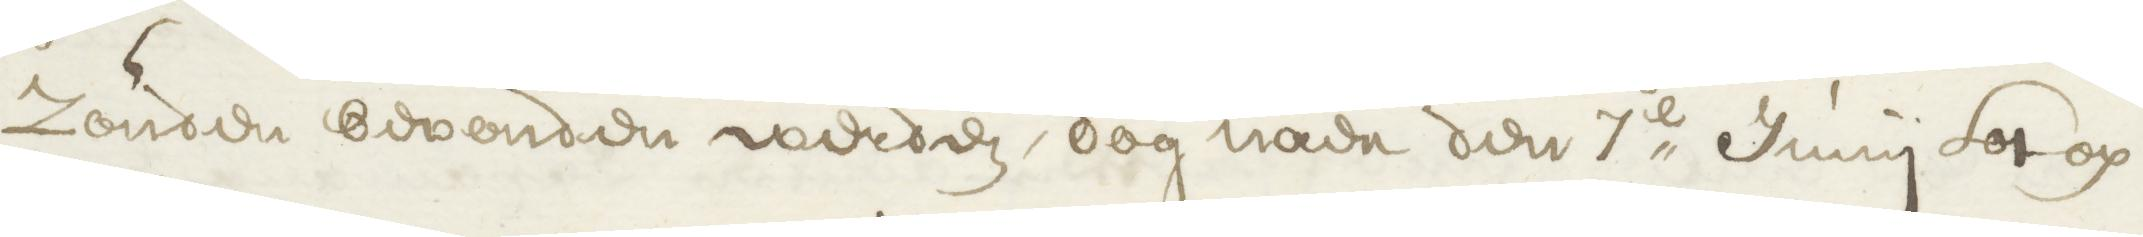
zouden bevonden werden, dog naer den 7„e Junij tot op
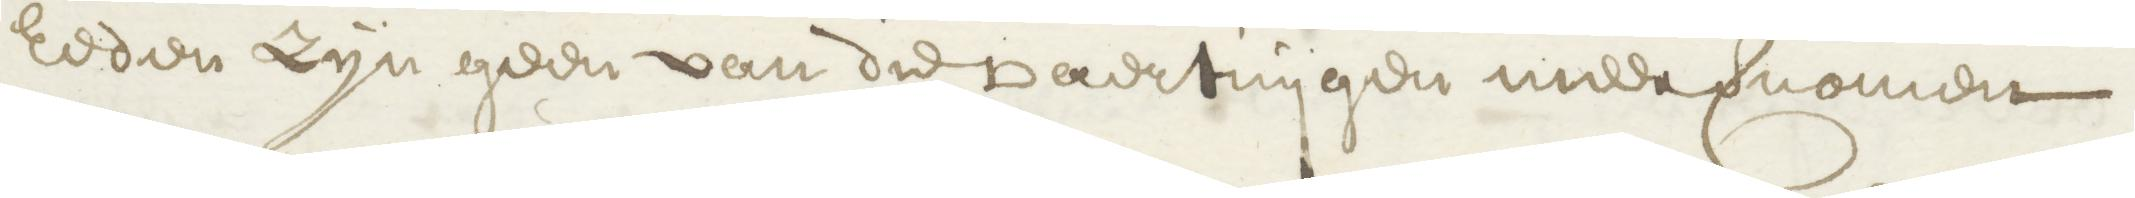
heden zijn geen van die vaertuijgen meer vernomen.
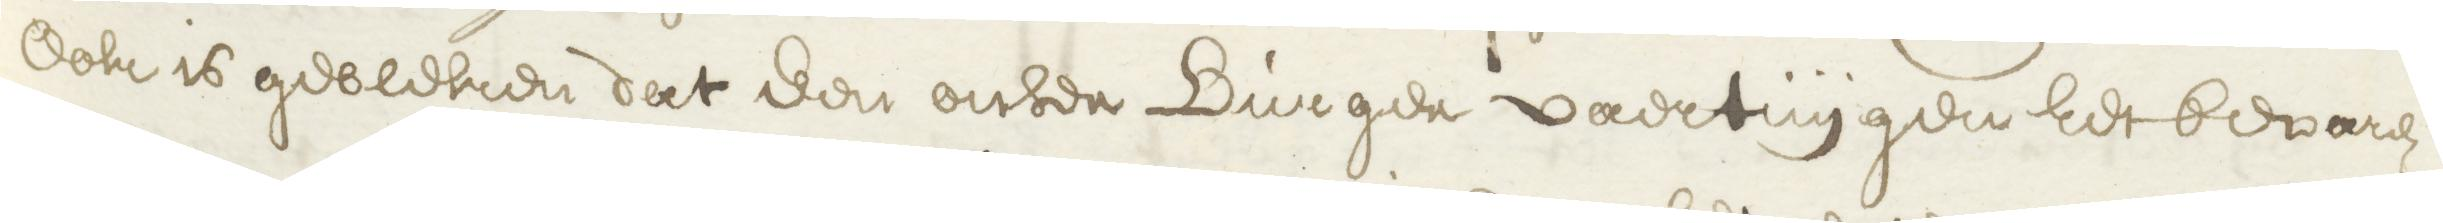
Ook is gebleken dat Een onser Burger vaertuijgen het bevaren
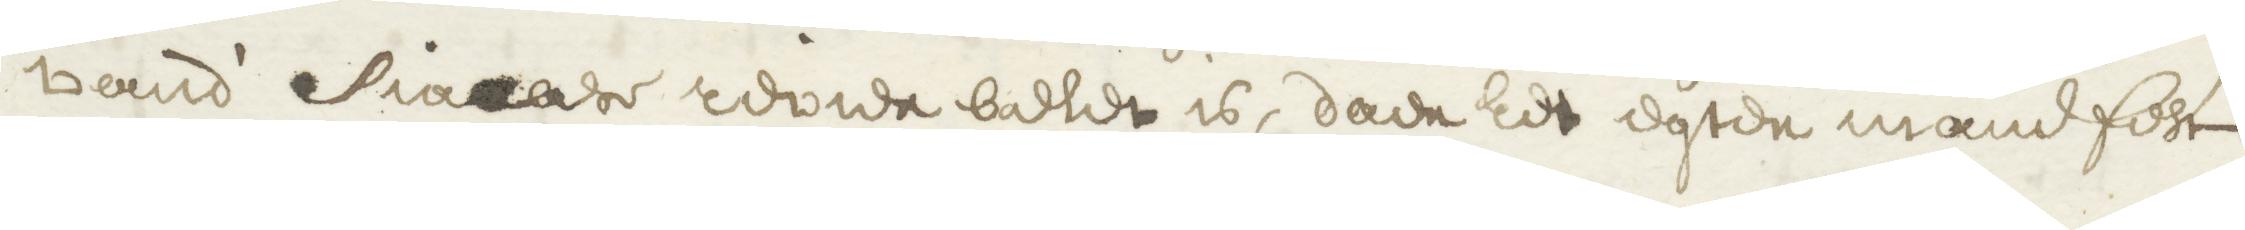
vand’ Siacase revier belet is, daer het egter manefest
